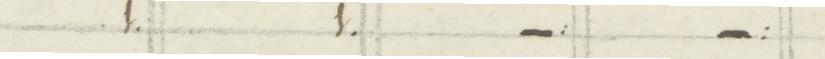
1. 1. —: —:
